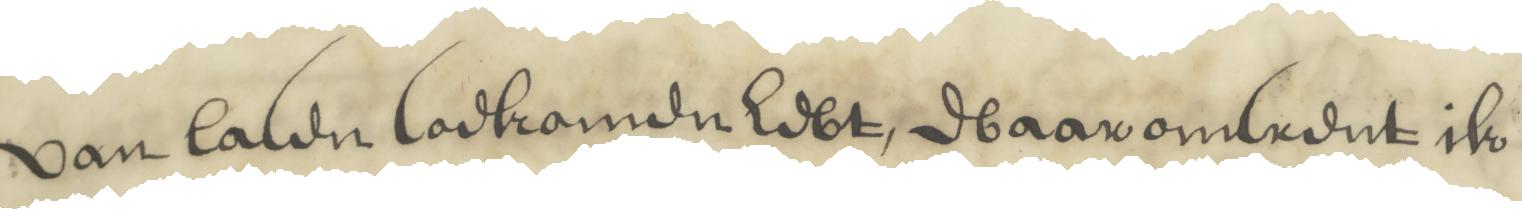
van laten toekomen hebt, waar omtrent ik
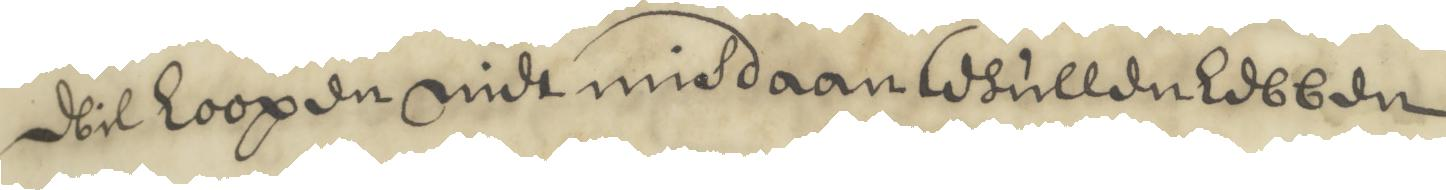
wil hoopen niet misdaan te sullen hebben
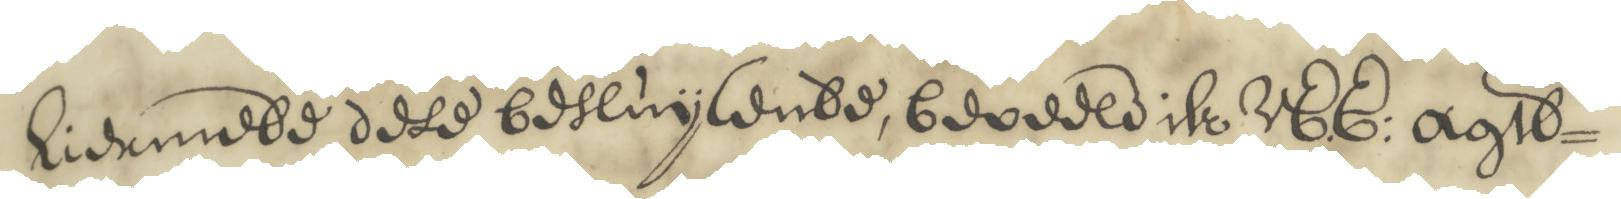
hiermede dese besluijtende, beveeld ik VEE: agtb=
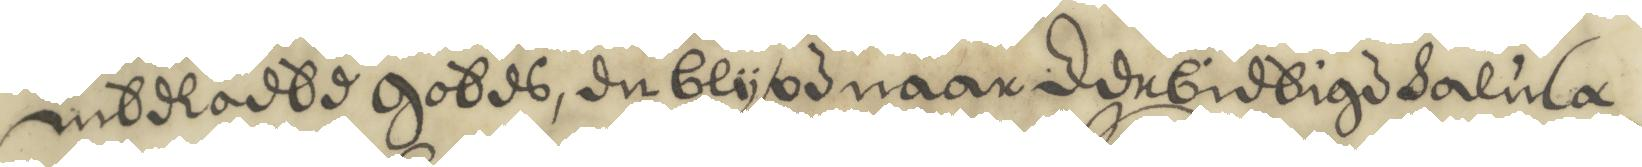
indehoede godes, en blijve naar Eerbiedige saluta
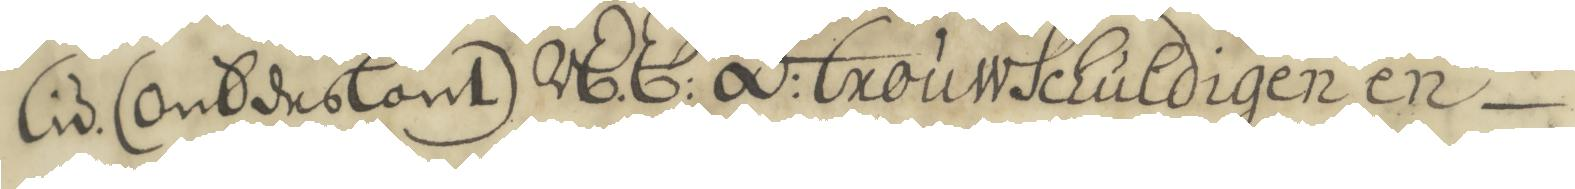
tie. (onderstont) vE.E: a: trouwschuldigen en —
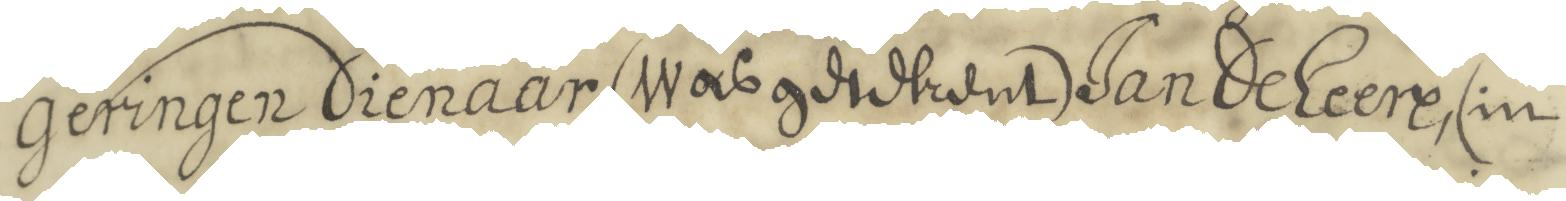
geringen dienaar (was getekent) Ian de heere, (in
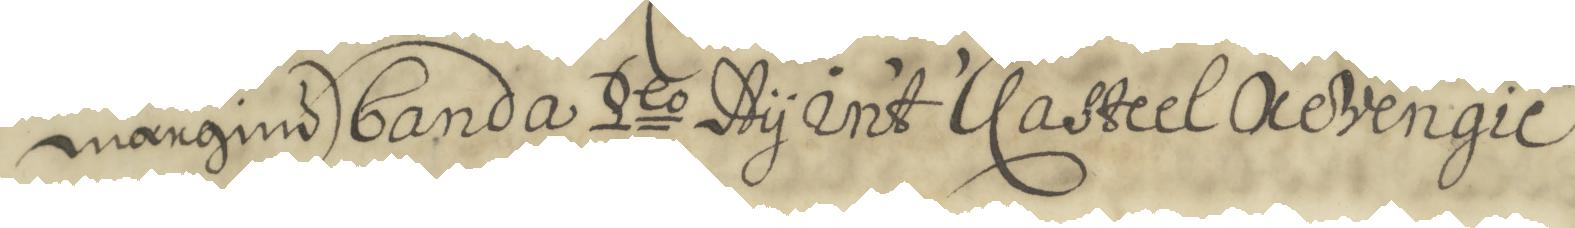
margine) banda P=lo Aij in't ’tCasteel revengie
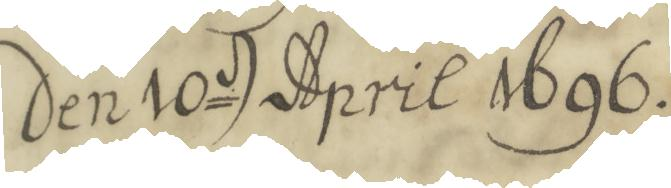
den 10=en April 1696.
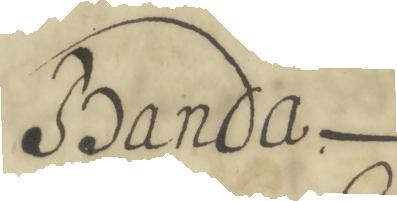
Banda. —
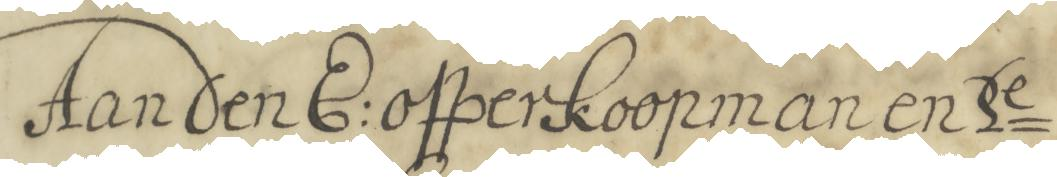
Aan den E: opperkoopman en P=e
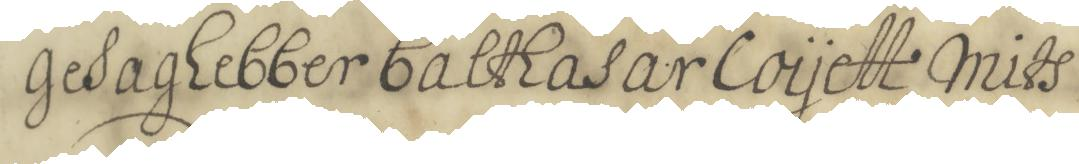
gesaghebber balthasar Coijett mits
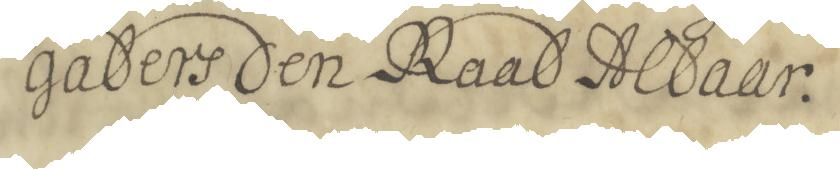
gaders den Raad Aldaar.
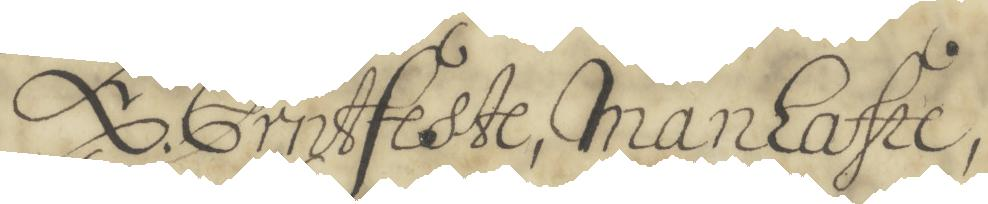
E. Erntfeste, manhafte,
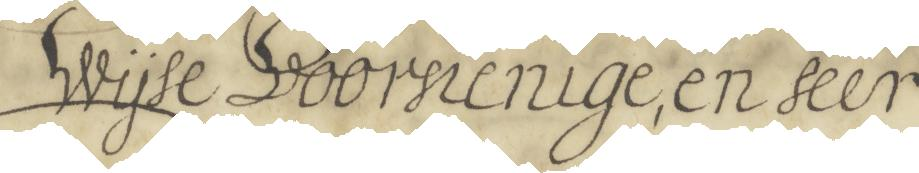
wijse voorsienige, en seer
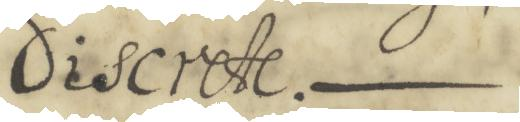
discrete. —
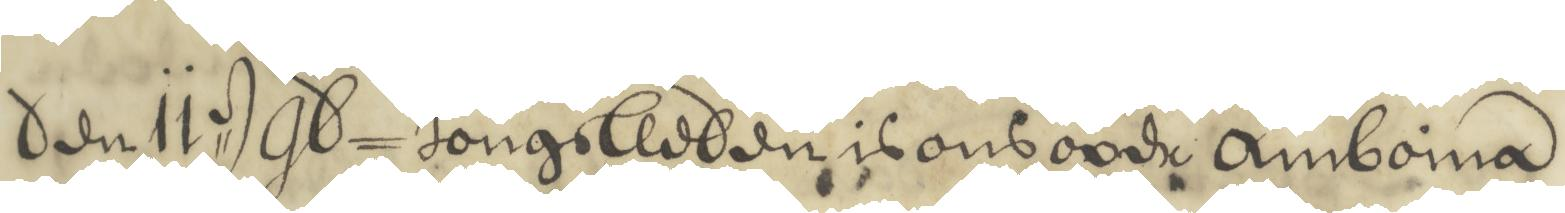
den 11„en 9b= Jongstleden is ons over amboina
